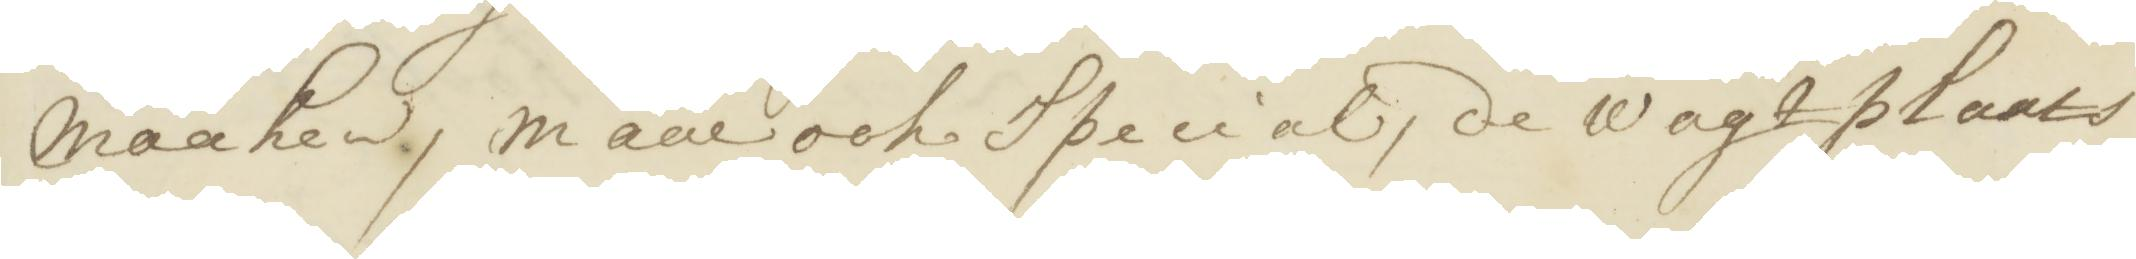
maaken, maar ook special, de wagtplaats
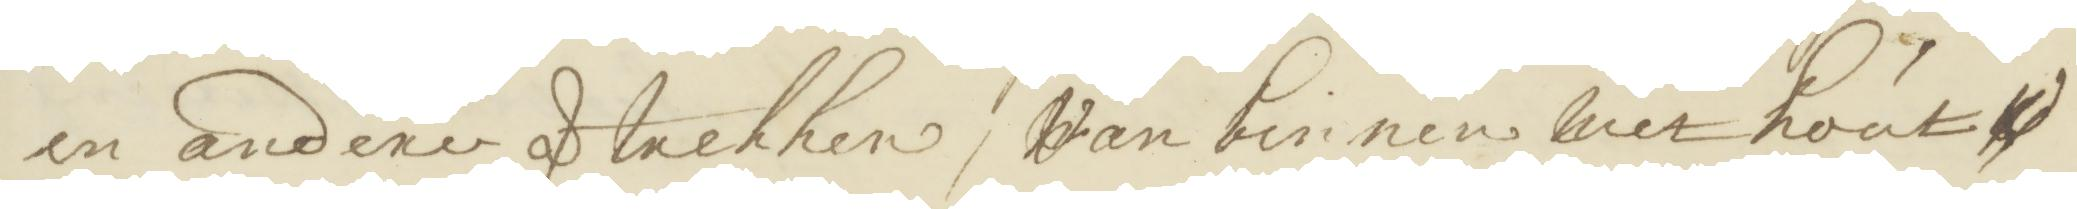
en andere vertrekken , van binnen met hout d
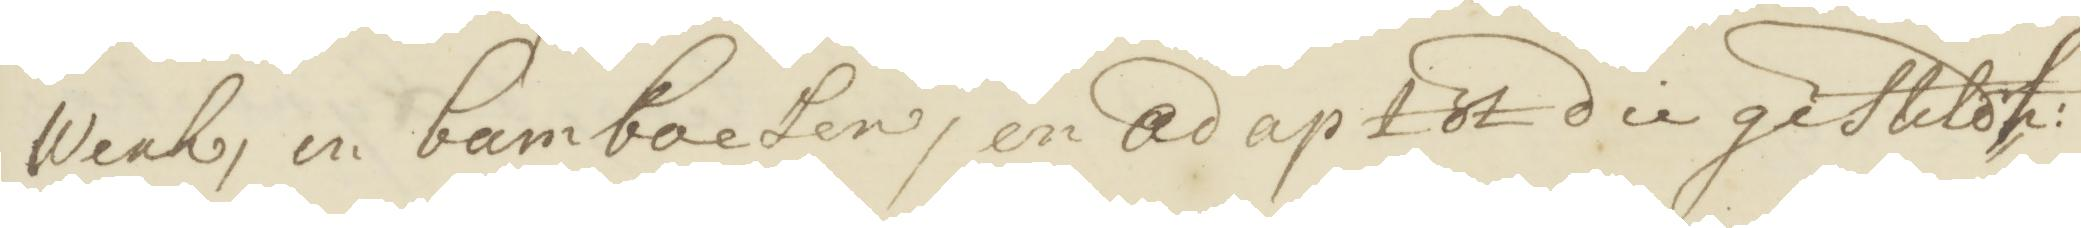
werk, en bamboezen, en ad ap tot die gesteldh:
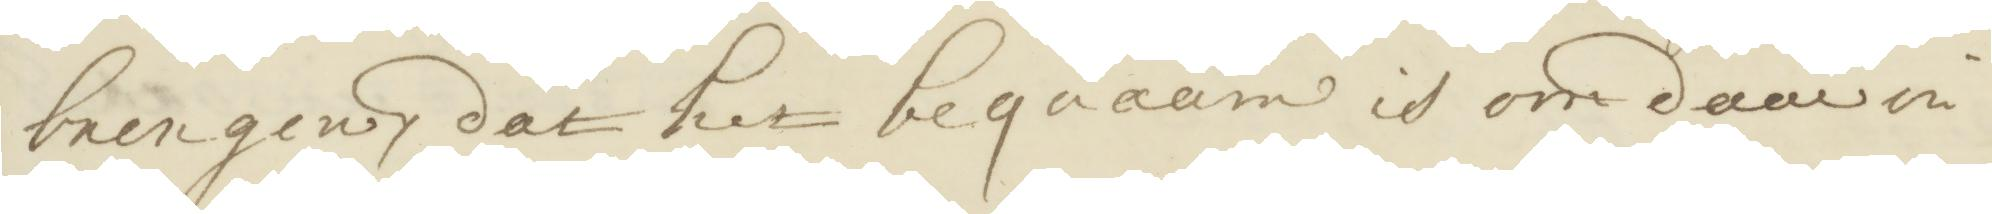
brengen, dat het bequaam is om daar in
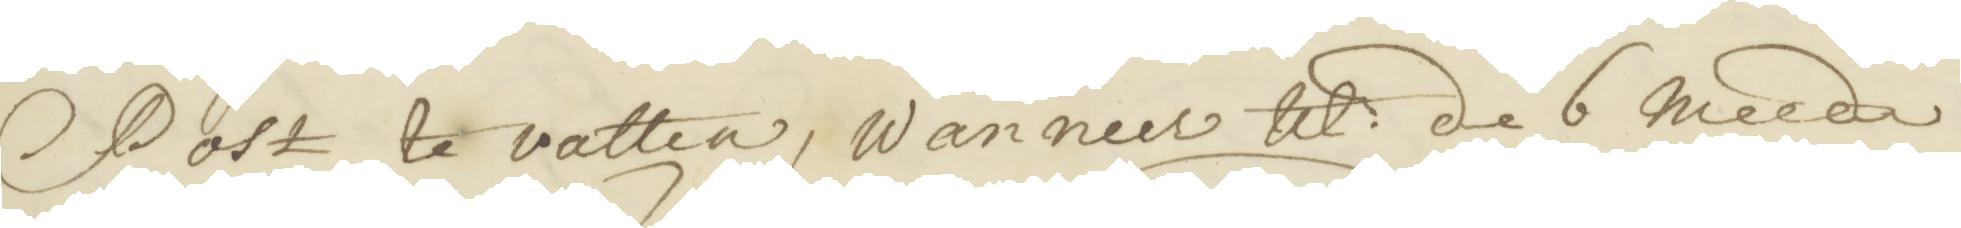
Post te vatten, wanneer ul: de 6 meede
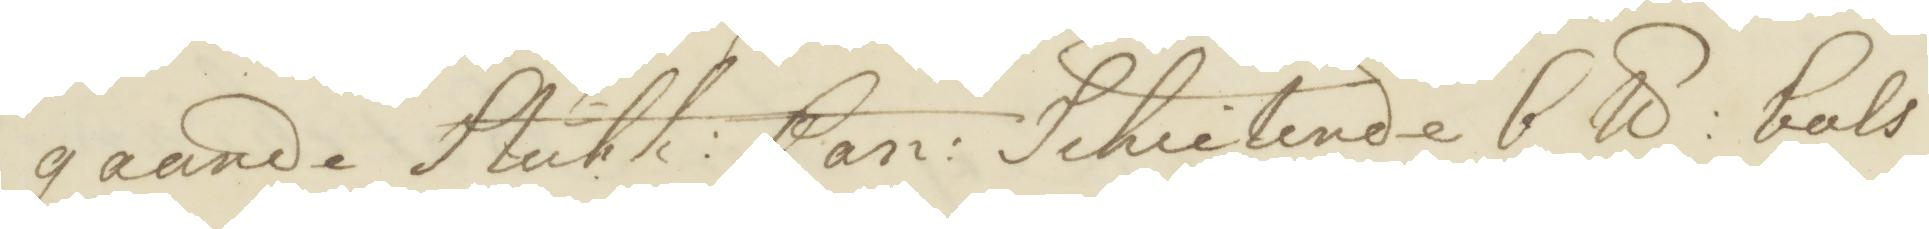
gaande stukk: Can: Schieterde 6 lb: bals
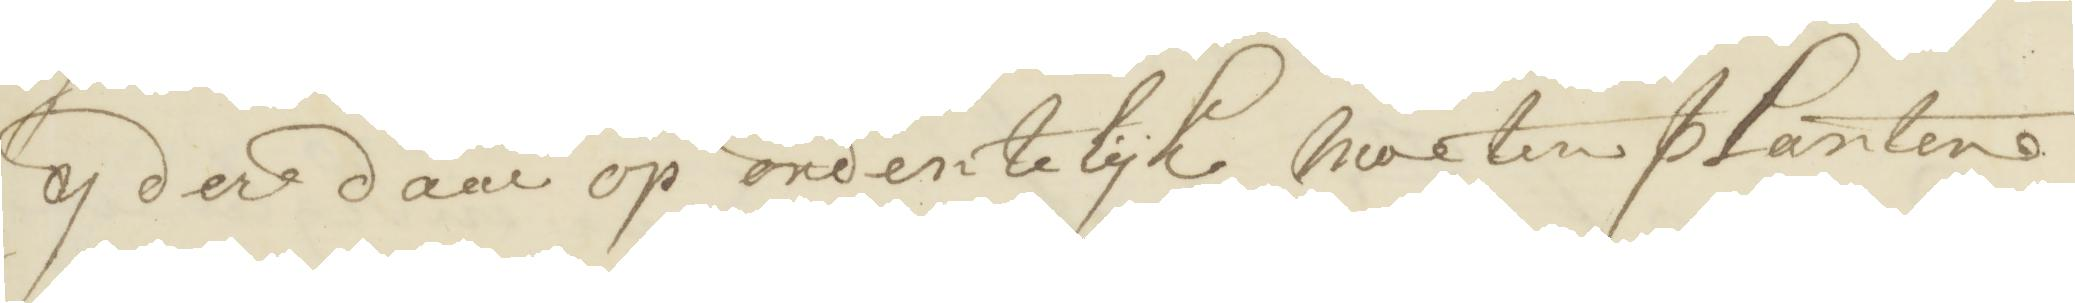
yder daar op ordentelijk moeten planten
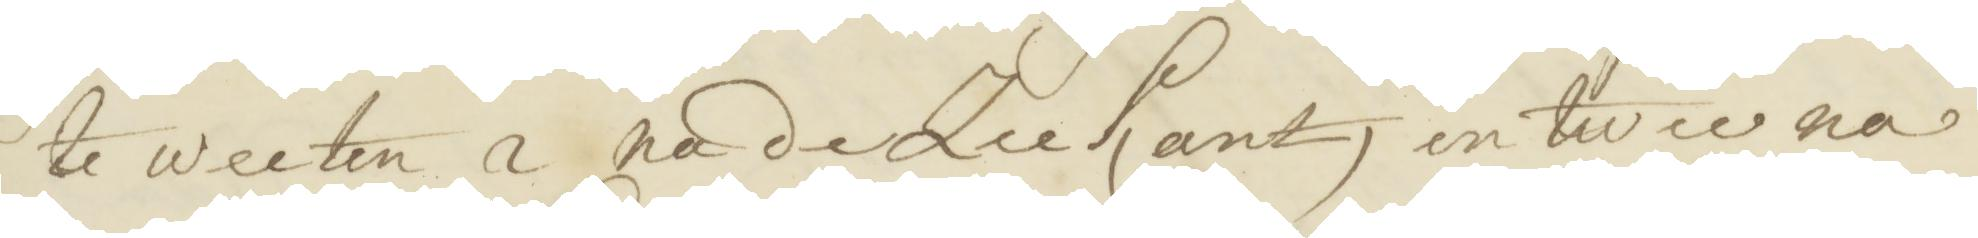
te weeten 2 na de zeekant; en twee na
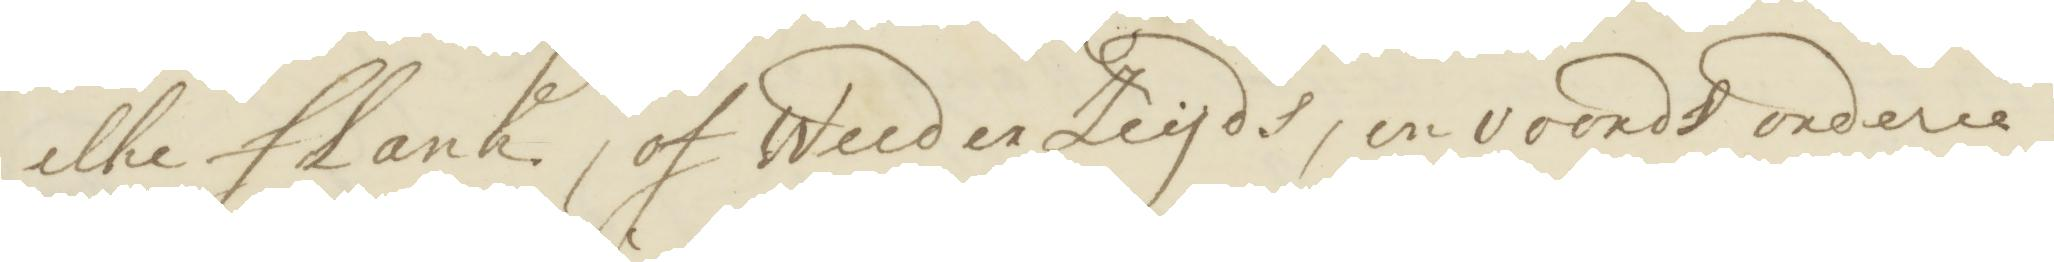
elke flank, of weederzeijds, en voords orders
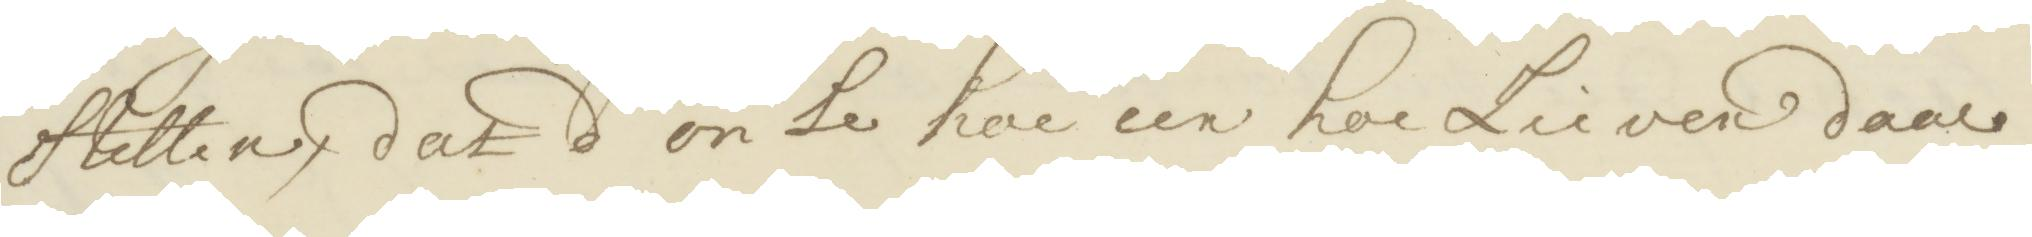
stellen, dat d’ onse hoe een hoe Liever daar
